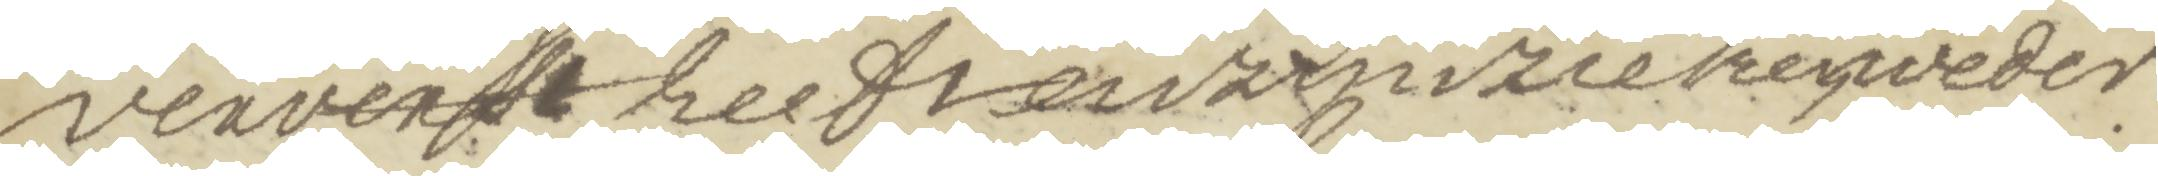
ververst heeft en zyn zieken weder
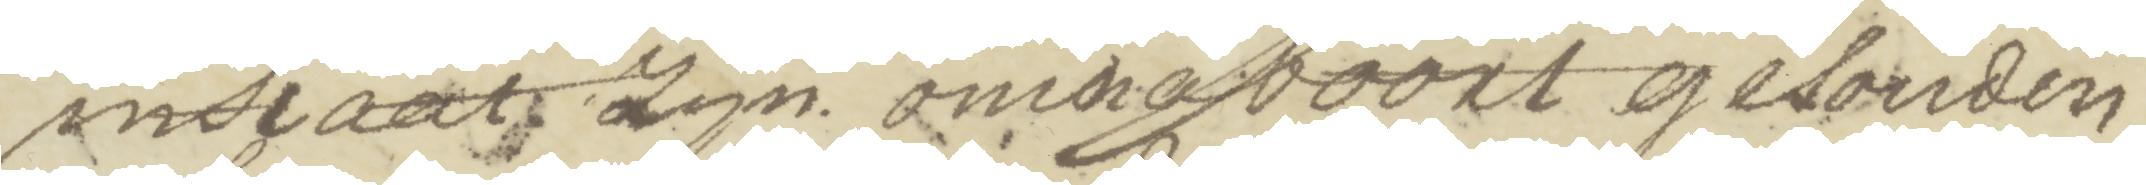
instaat zijn om na boort gesonden
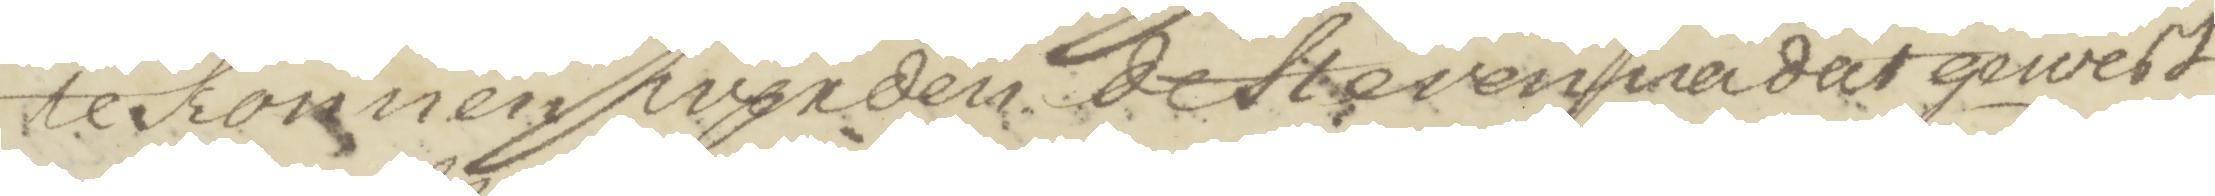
te konnen werden desteven na dat gewest
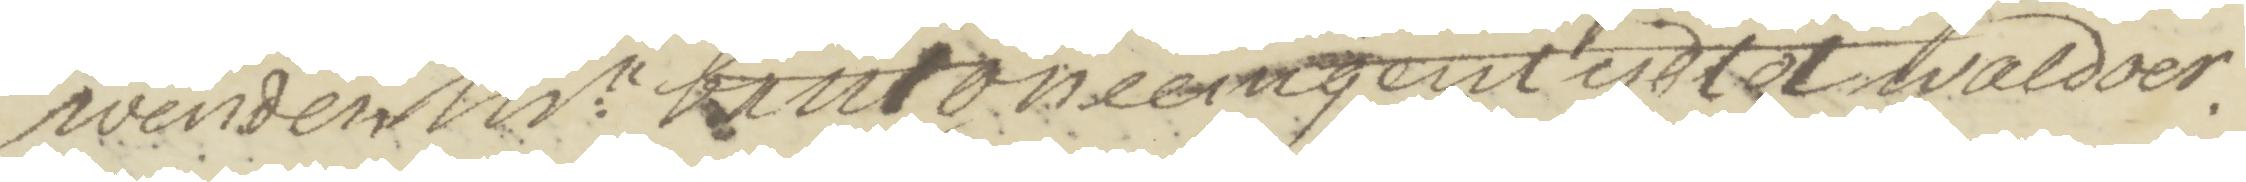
wenden M:r bruto neemgen tyd tot waldoer.
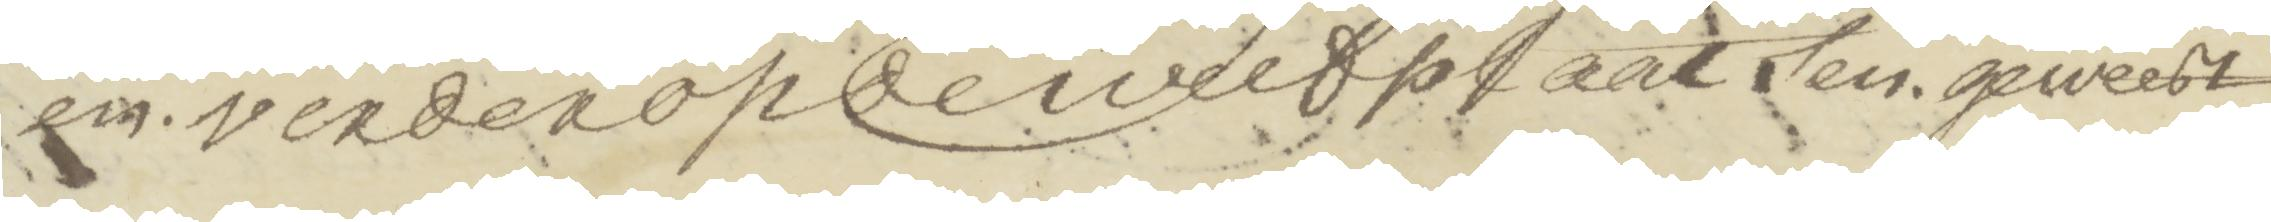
en verder op de weefplaatsen. geweest
